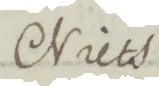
Niets
